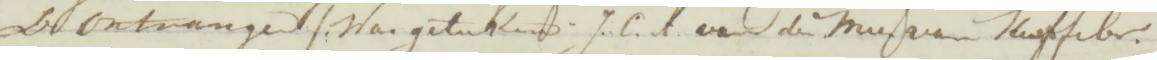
De ontvanger /:Was geteekend J: C. A. van der Meer van Kuffeler:
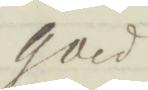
Goed
